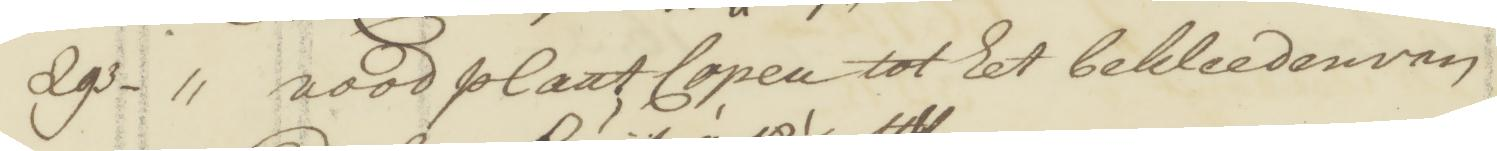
293 – „ rood plaat Coper tot het bekleeden van
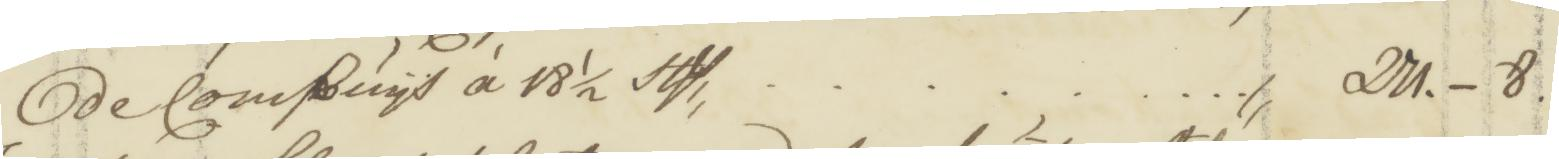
de Combuijs á 18½ stver„s . . . . . . . . . „ 271. — 8
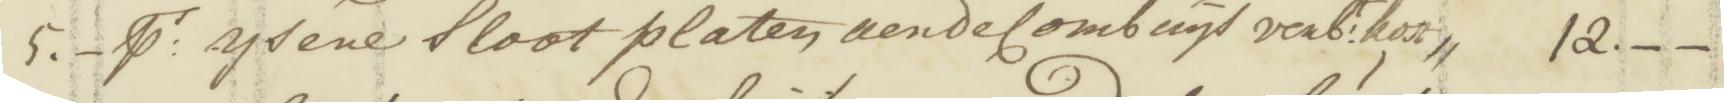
5. – p:s ysere sloot platen aen de Combuijs verb:t kost „ 12. — —
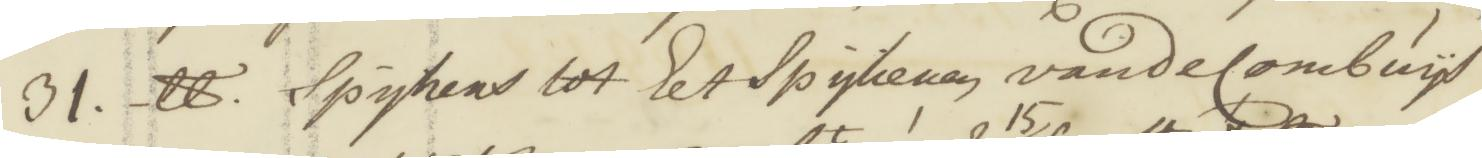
31. – lb spijkers tot het spijkeren van de Combuijs
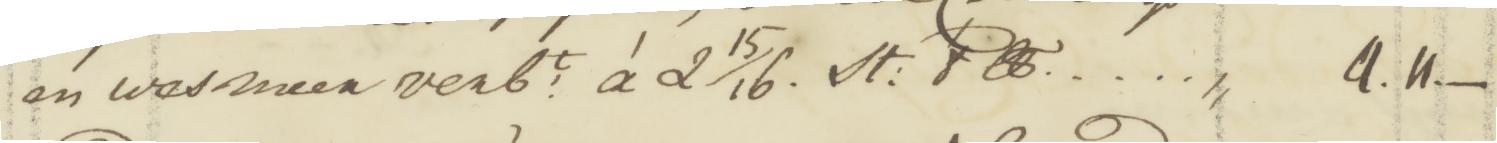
en wes meer verb:t á 2 15/16. st: 't lb. . . . . „ 4. 11.—
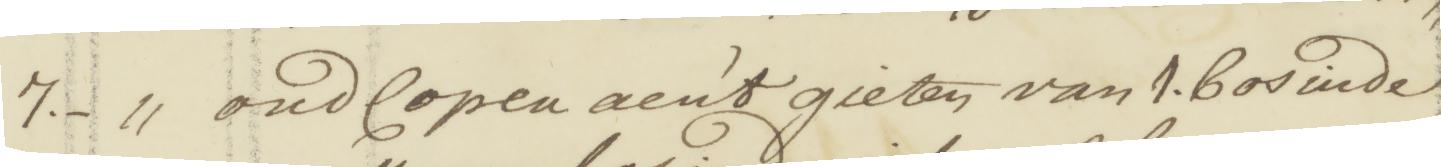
7. – „ ond Coper aen 't gieten van 1. bos inde
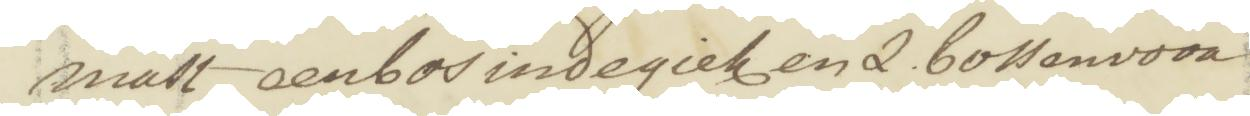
mast, een bos indegiek en 2. bossenvoor
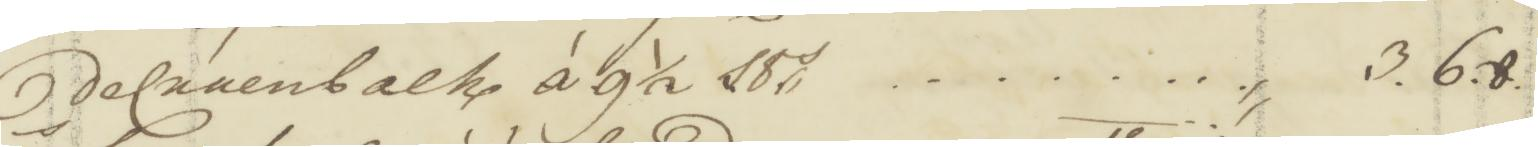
de Craenbalk á 9½ st„s . - . . . . . .„ 3. 6. 8.
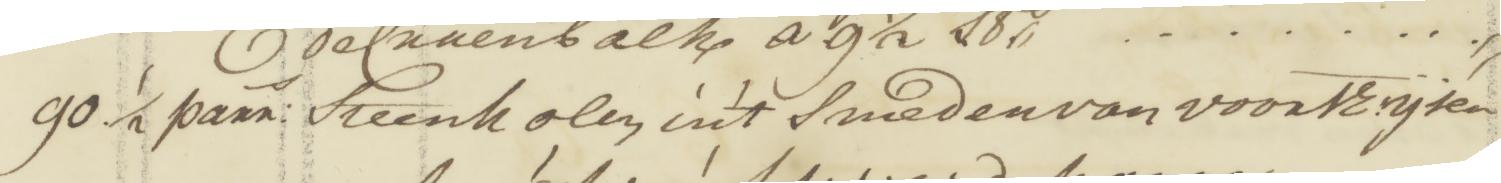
90.½ parr:s steenkolen in’t smeden van voorsz ijser
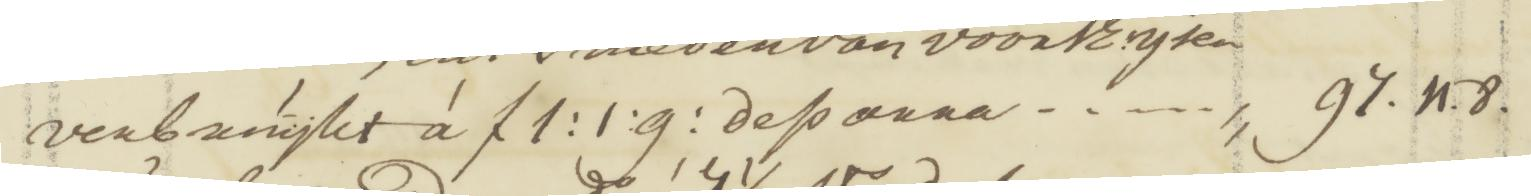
verbruijkt á ƒ1: 1: 9: de parra - - - - - „ 97. 11. 8.
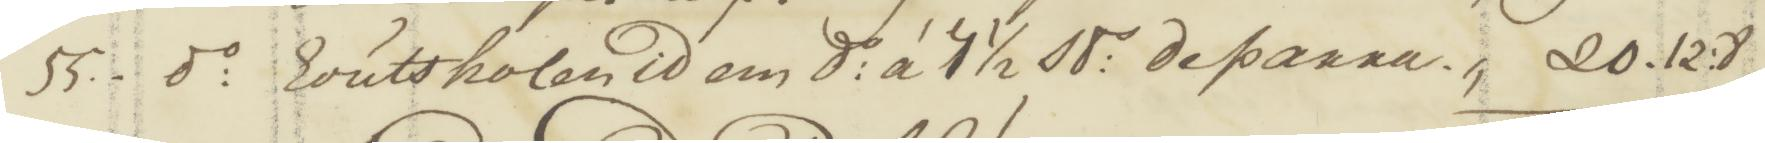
55. – d:o houtskolen idem d:o á 7½ st:s de parra. „ 20.12:8
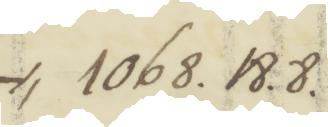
„ 1068.18.8.
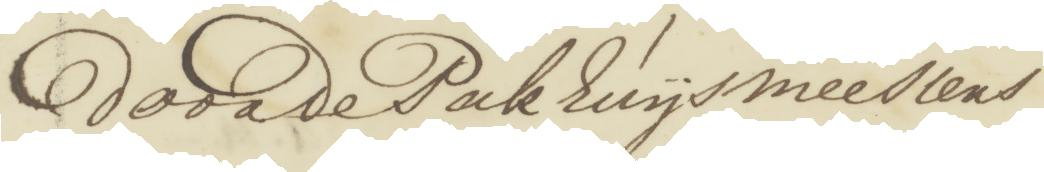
door de Pakhuijsmeesters
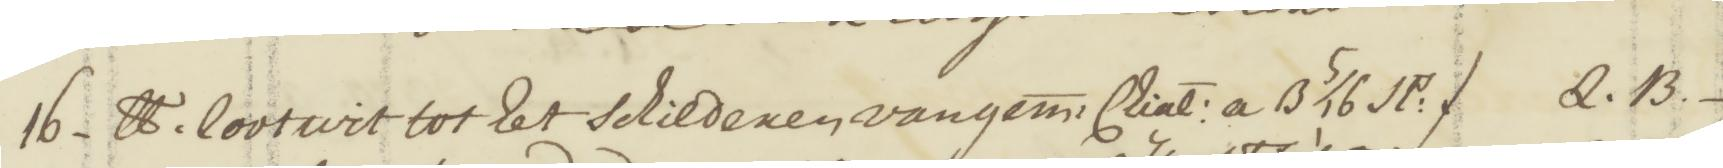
16 – lb. lootwit tot het schilderen van gem: Chial: a 13 5/16 st:s ƒ 2.13. —
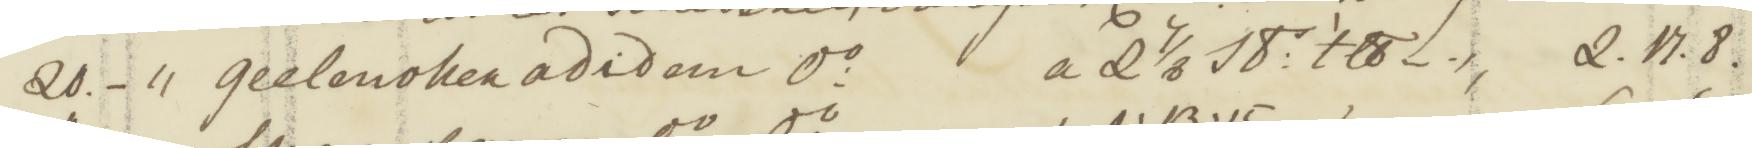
20. – „ geelenoker ad idem d:o a 2 7/8 st:s: 't lb. - „ 2. 17. 8.
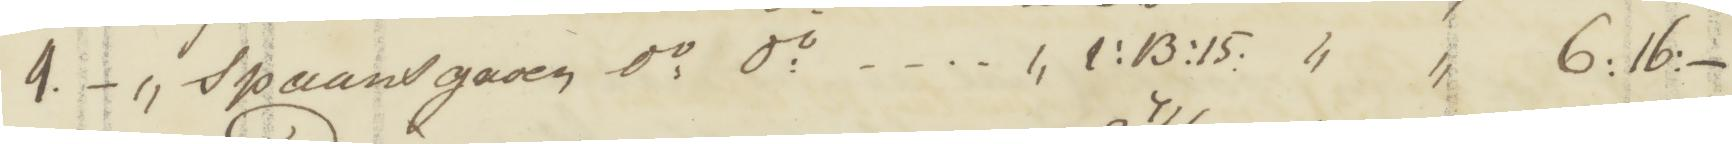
4. – „ spaans groen d:o d:o - - . - „ 1:13:15: „ „ 6:16:—
